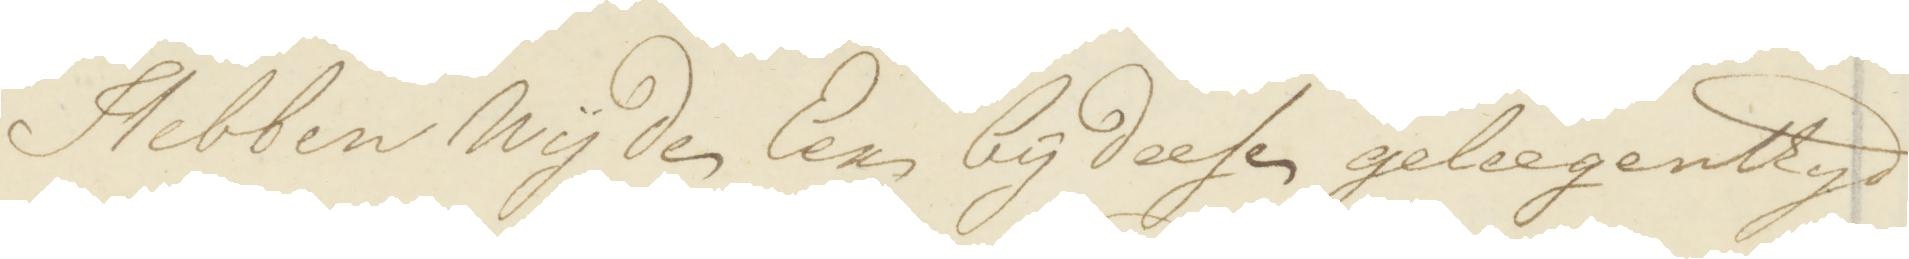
Hebben wij de Eer bij deese geleegenthyd
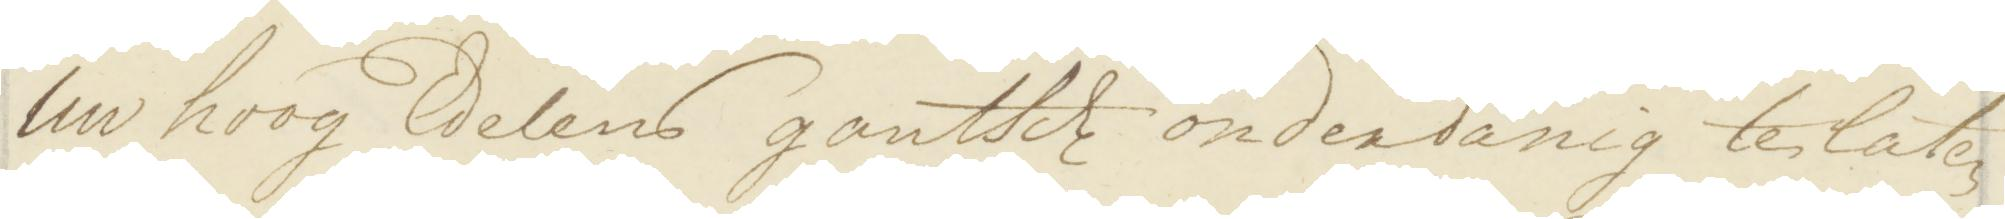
uw hoog Edelens gantsch onderdanig te laten
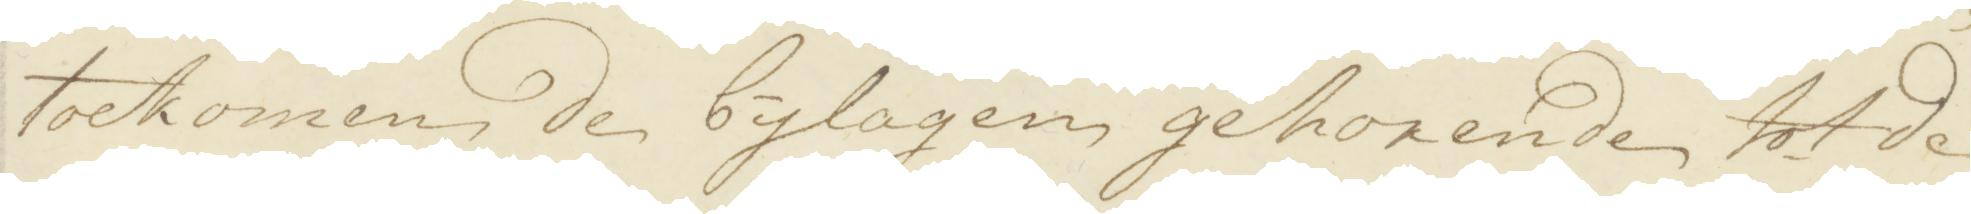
toekomen de bijlagen gehorende tot de
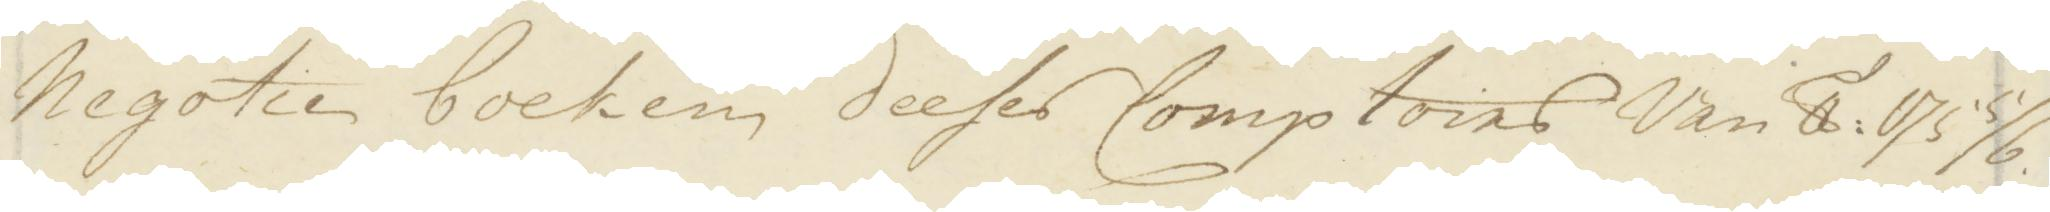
negotie boeken deeses Comptoirs van lb: 175 5/6.
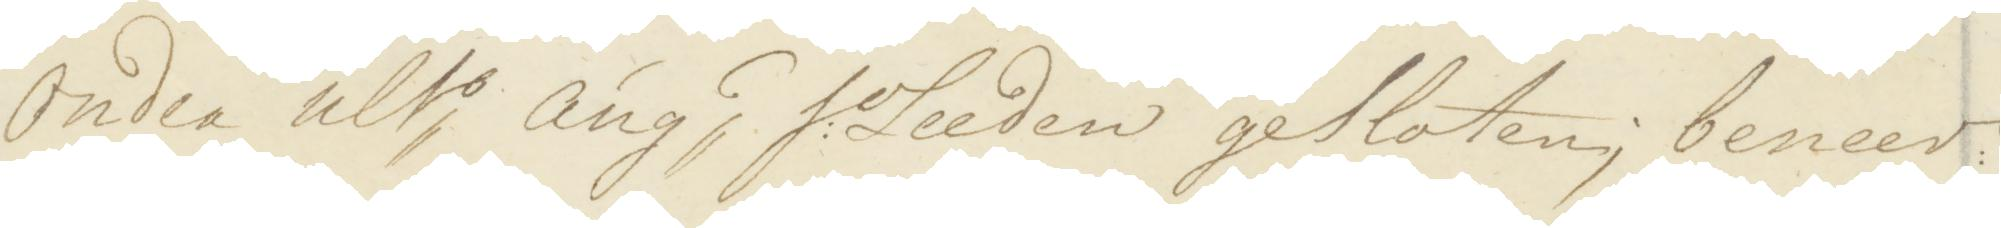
onder ult„o aug„' j:o leeden gesloten; beneev:
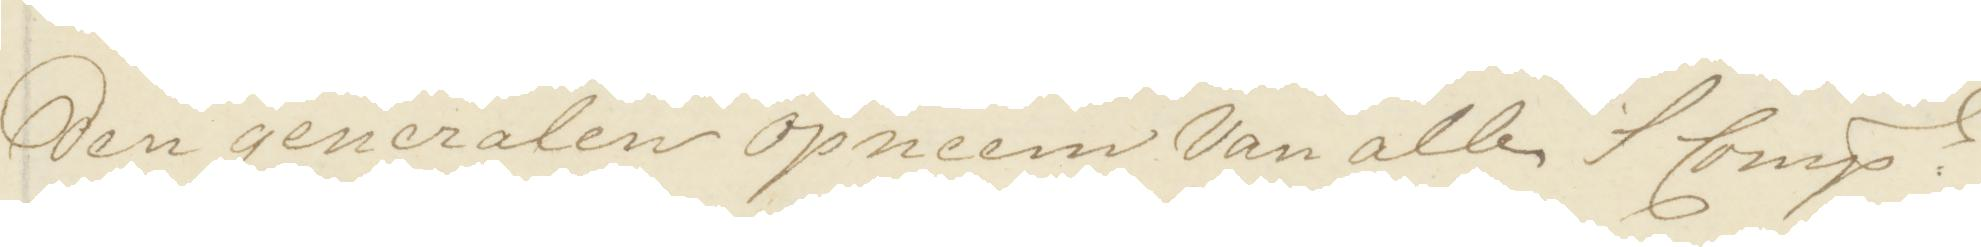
den generalen opneem van alle ’s Comp:s
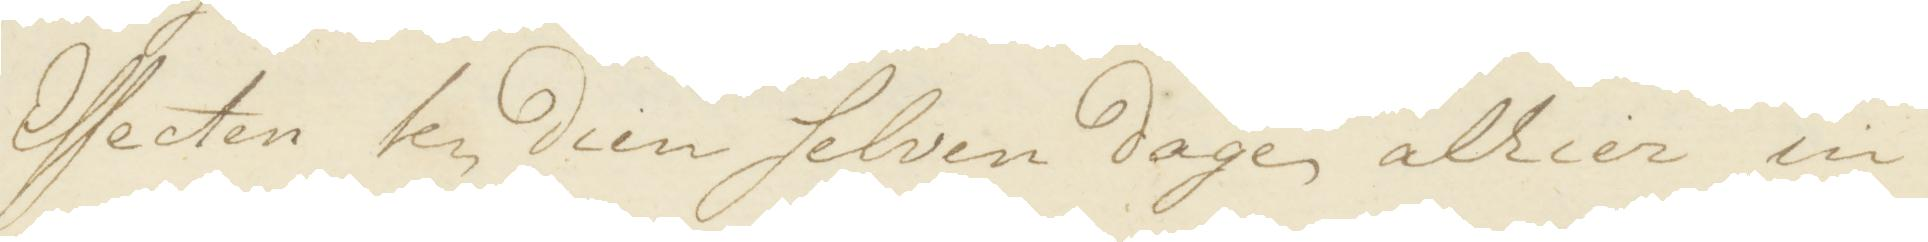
Effecten ten dien selven dage alhier in
